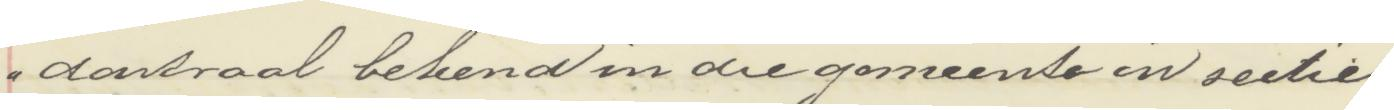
„dastraal bekend in die gemeente in sectie
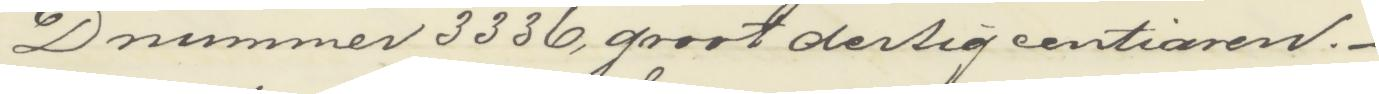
D nummer 3336, groot dertig centiaren.-
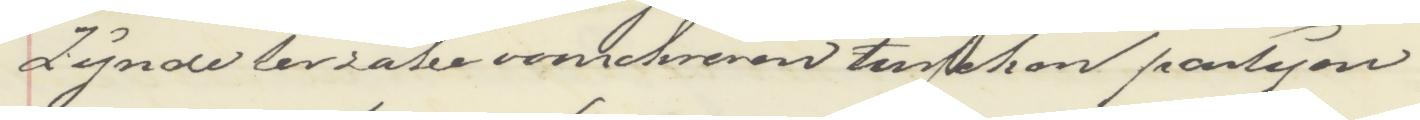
Zijnde ter zake voorschreven tusschen partijen
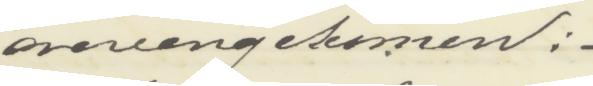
overeengekomen:
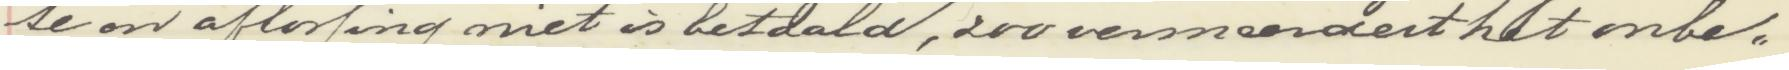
te en aflossing niet is betaald, zoo vermeerdert het onbe„
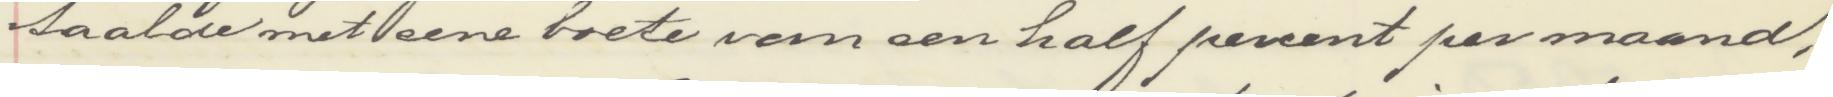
taalde met eene boete van een half percent per maand,
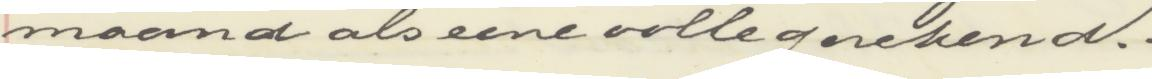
maand als eene volle gerekend.
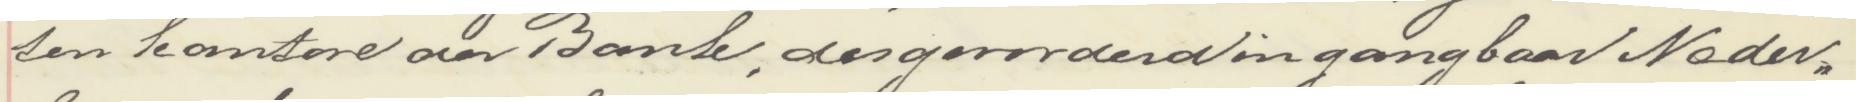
ten kantore der Bank, desgevorderd in gangbaar Neder„
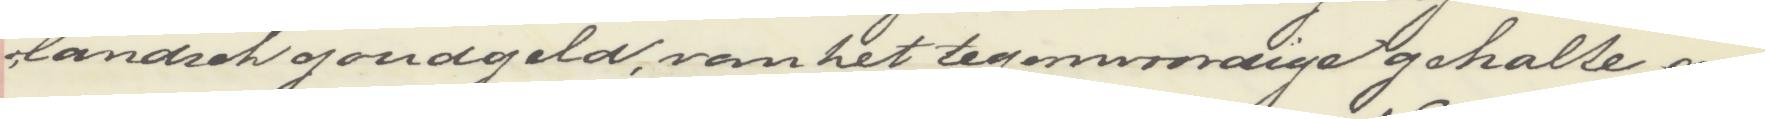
„landsch goudgeld, van het tegenwoordige gehalte en
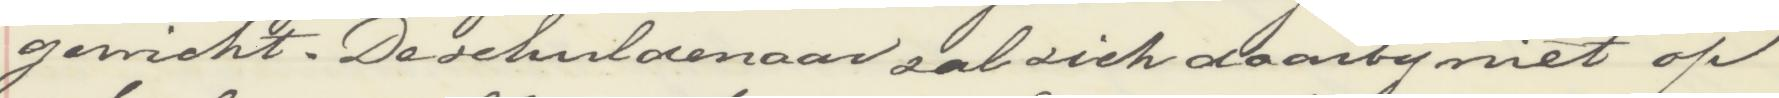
gewicht. De schuldenaar zal zich daarbij niet op
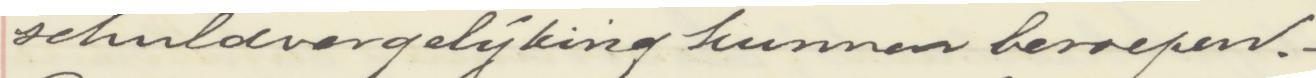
schuldvergelijking kunnen beroepen.
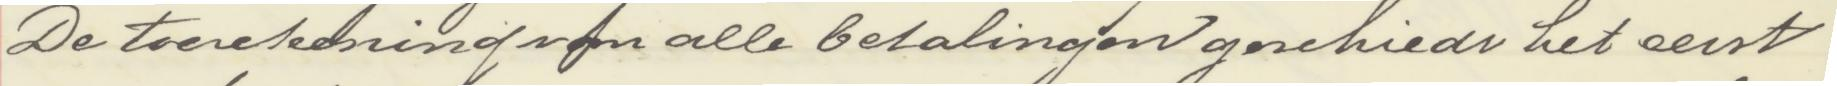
De toerekening van alle betalingen geschiede het eerst
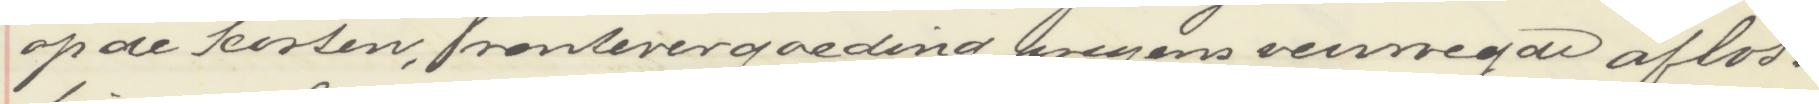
op de kosten, rentevergoeding wegens verlegde aflos„
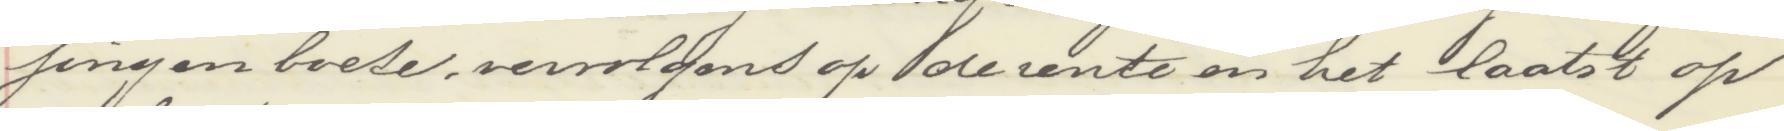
singen boete, vervolgens op de rente en het laatst op
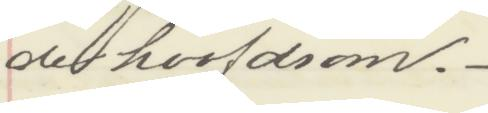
de hoofdsom.-
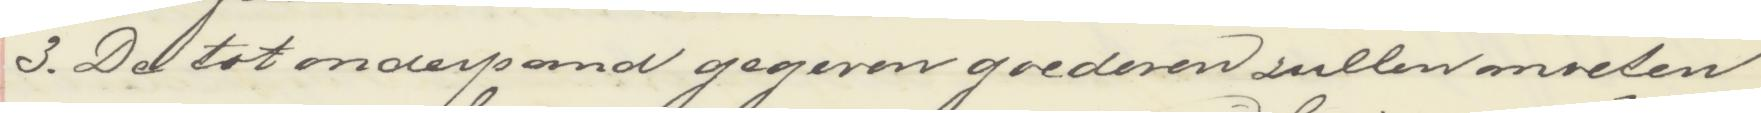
3. De tot onderpand gegeven goederen zullen moeten
